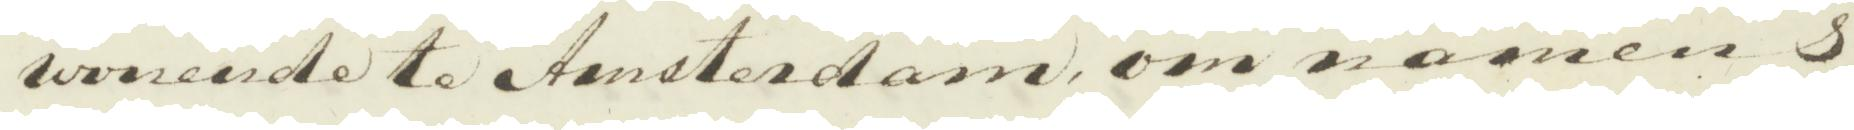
wonende te Amsterdam, om namens
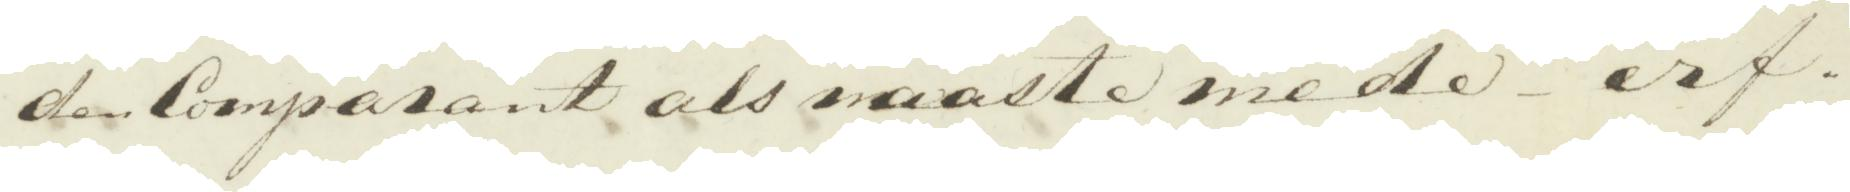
den Comparant als naaste mede - erf„
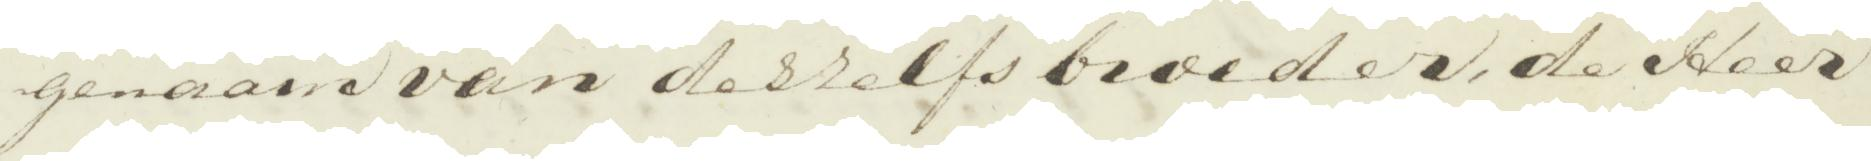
genaam van deszelfs broeder, de Heer
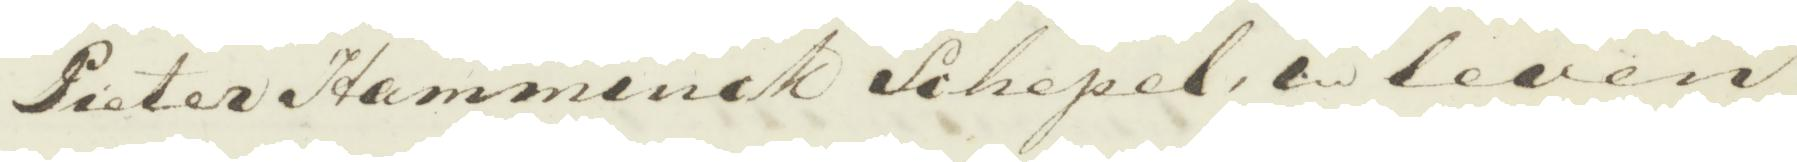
Pieter Hamminck Schepel, in leven
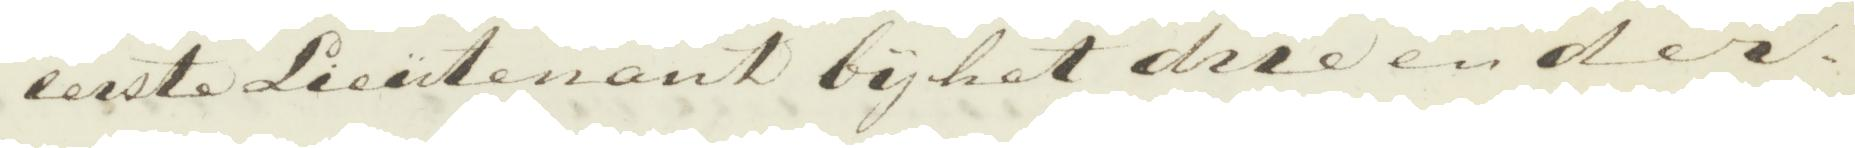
eerste Lieutenant bij het drie en der„
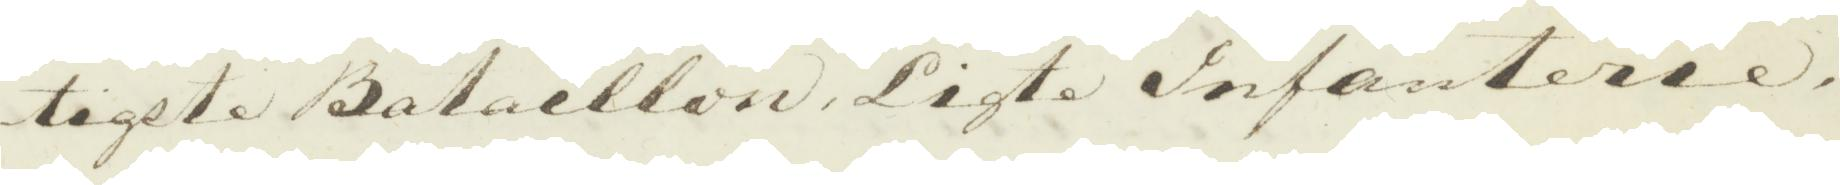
tigste Bataillon, Ligte Infanterie,
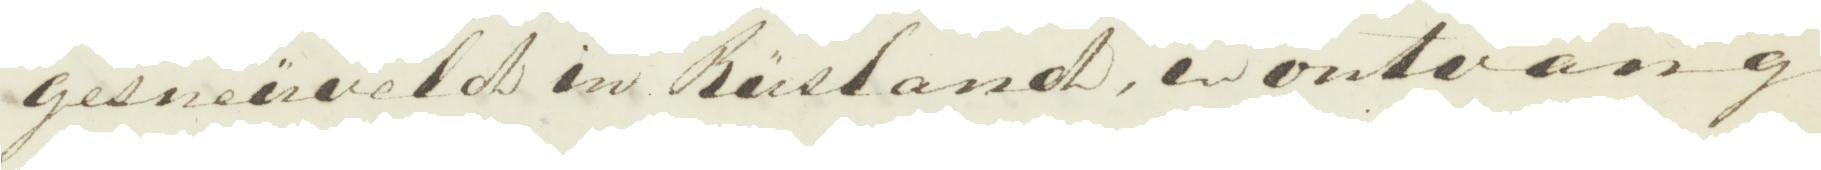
gesneuveld in Rusland, in ontvang
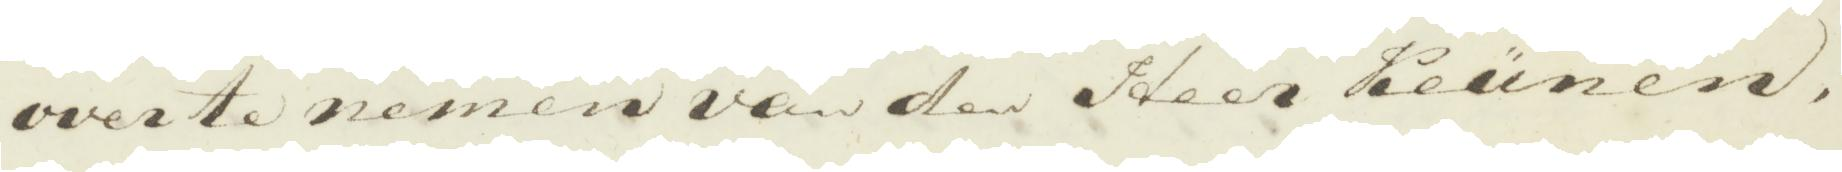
over te nemen van den Heer Keunen,
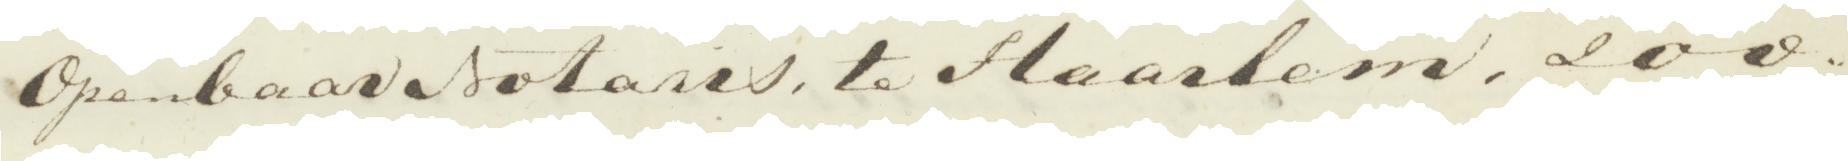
Openbaar Notaris, te Haarlem, zoo„
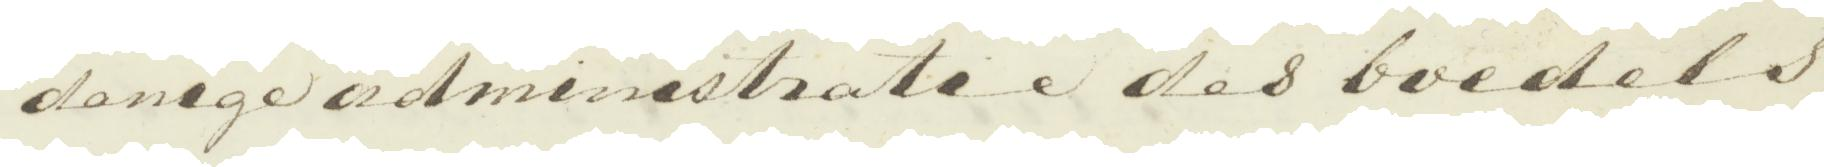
danige administratie des boedels
